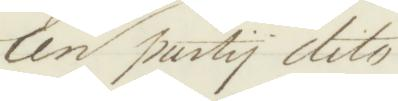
Een partij dito
